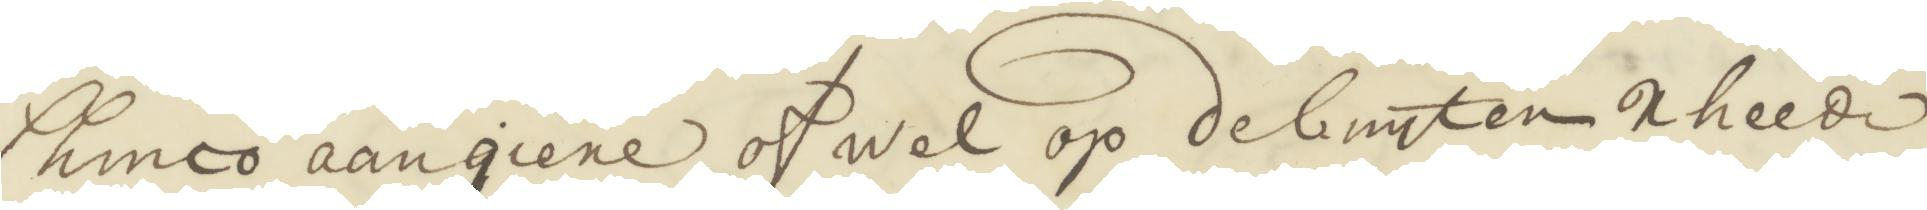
Chinco aangiere of wel op de buijten rheede
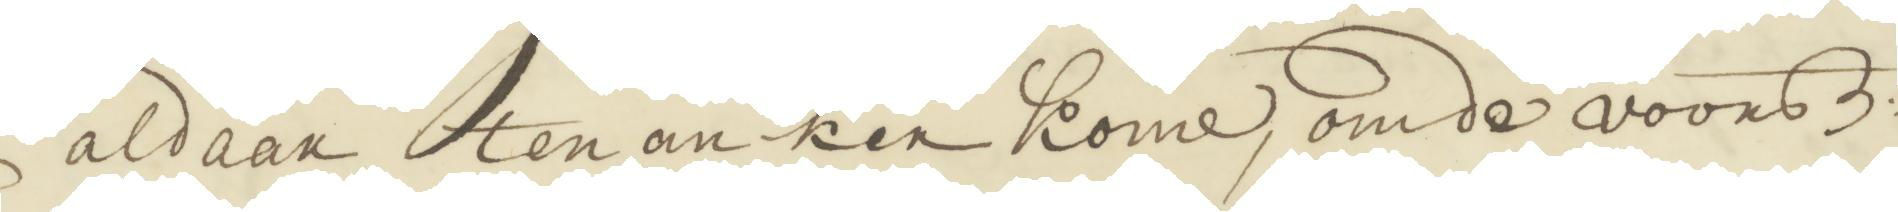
aldaar ten anker kome, om de voors:
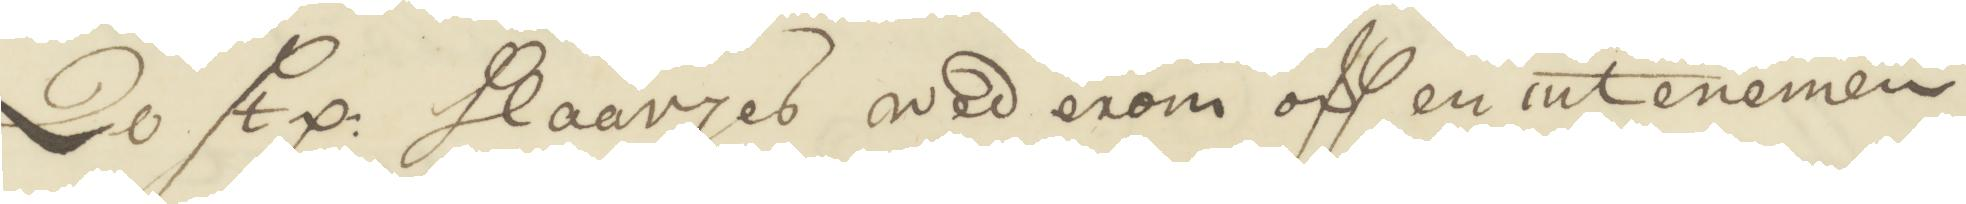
20 stx. slaavjes wederom over en intenemen
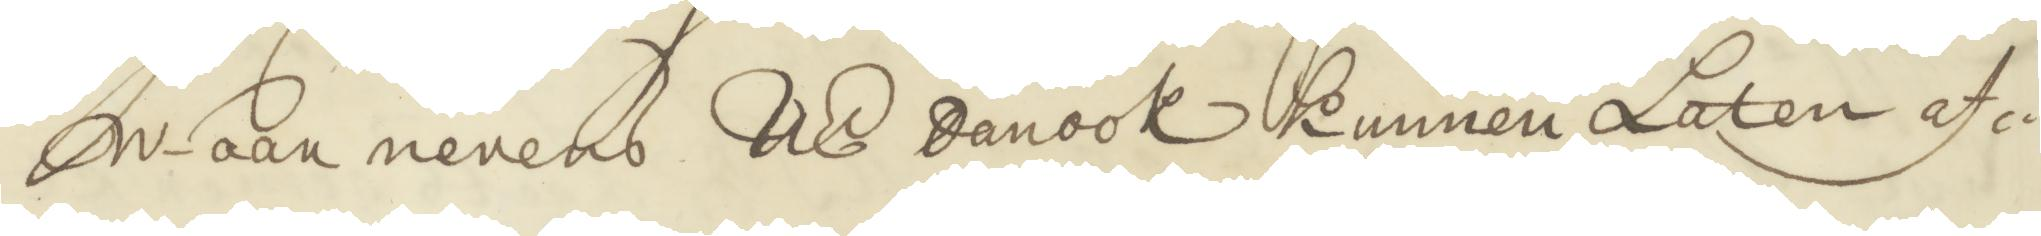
w_aar nevens UE danook kunnen Laten af
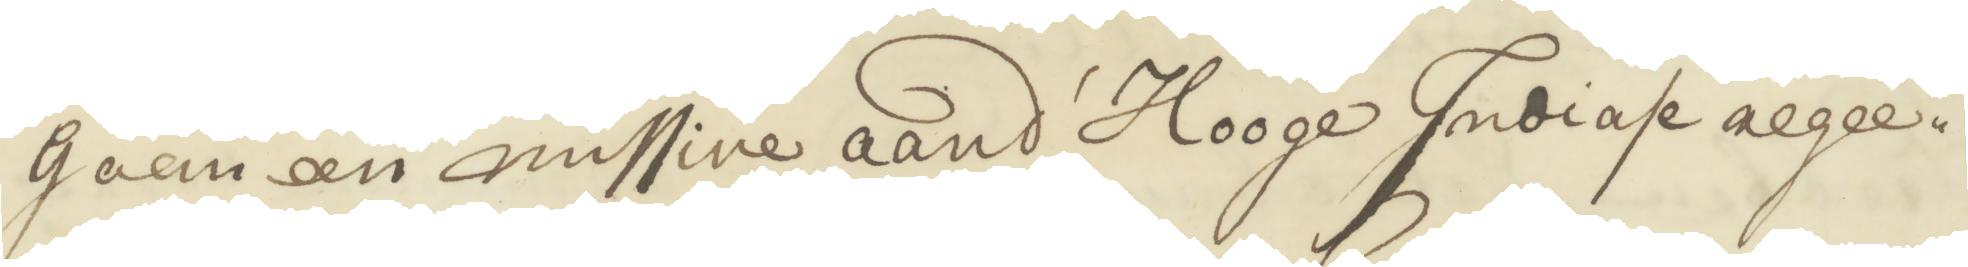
gaan een missive aan d’ Hooge Indiase regee„
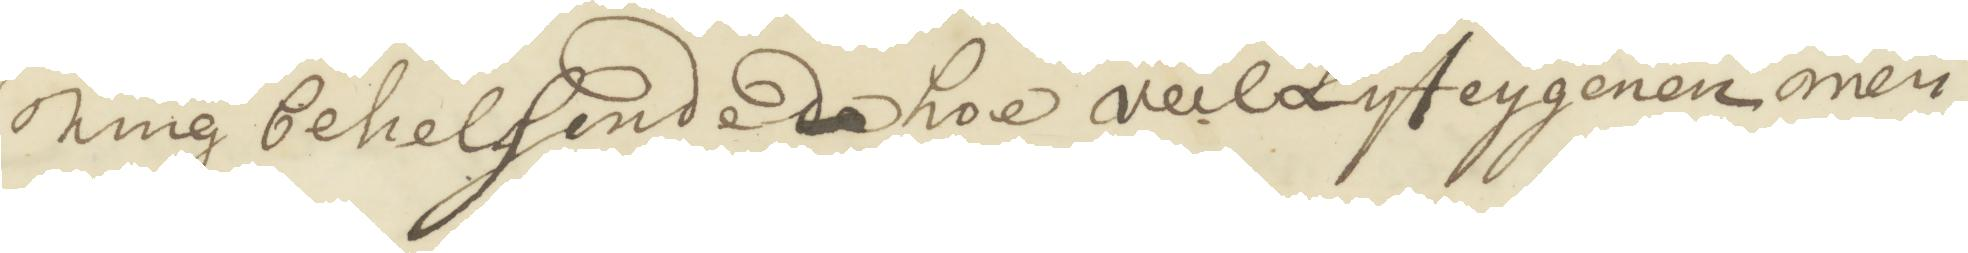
ring behelsende de hoe vele lyfeygenen men
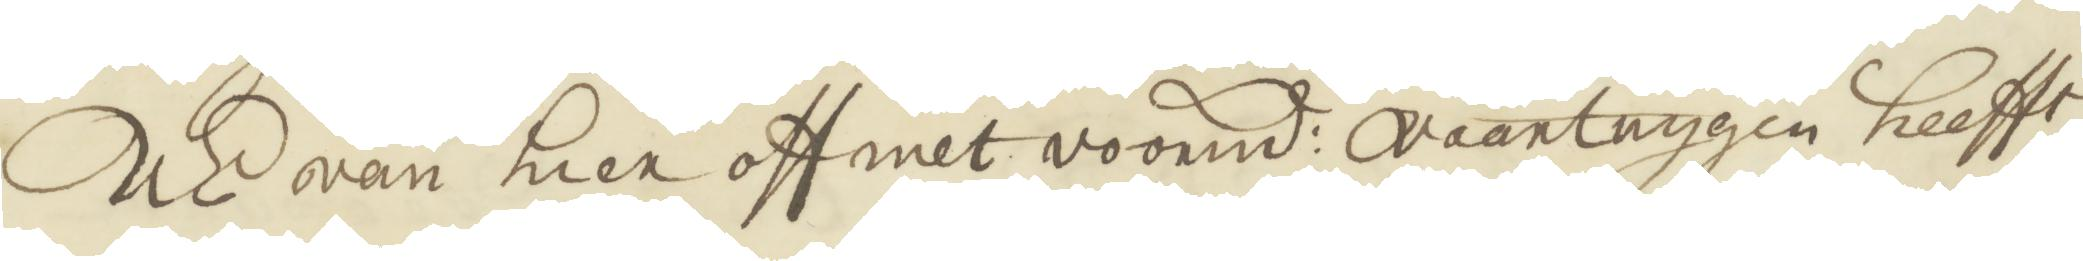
UE van hier off met voorm: vaartuygen heefft
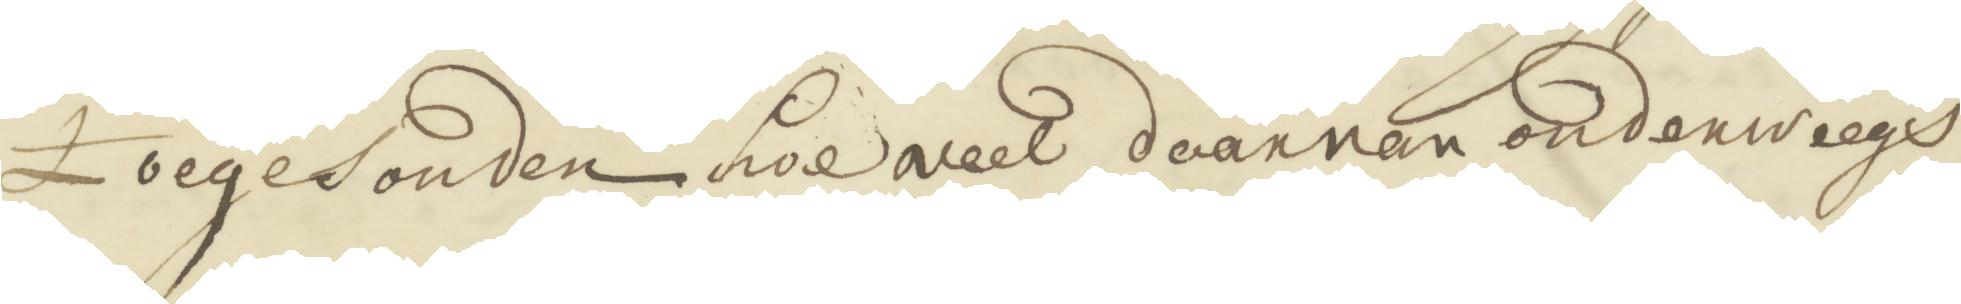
toegesonden hoe veel daarvan onderweegs
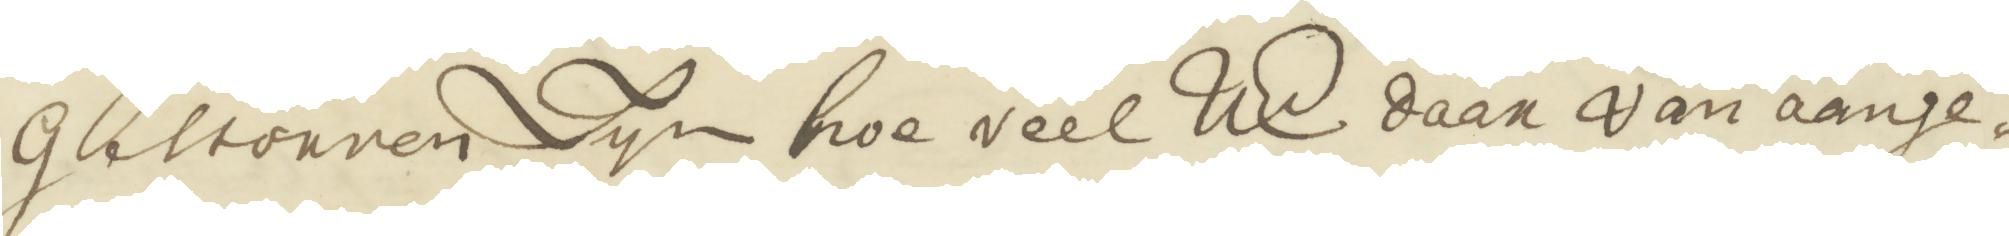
gestorven Zyn hoe veel UE daar van aange„
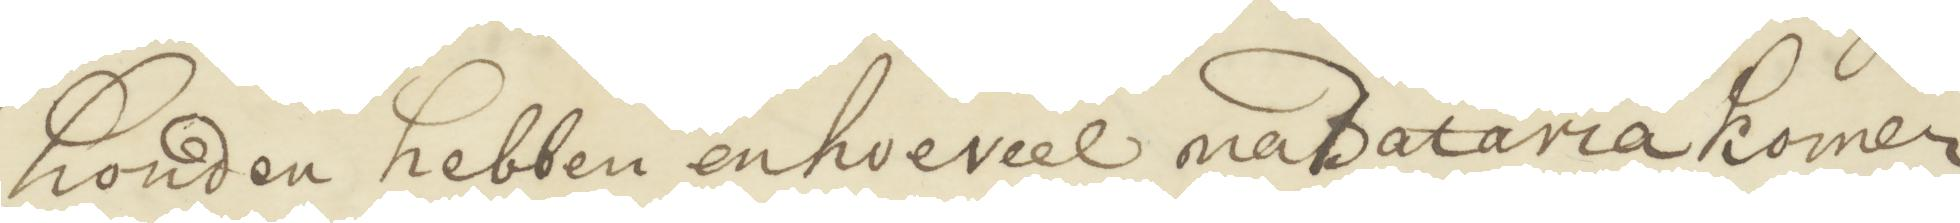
houden hebben en hoeveel na Batavia komen
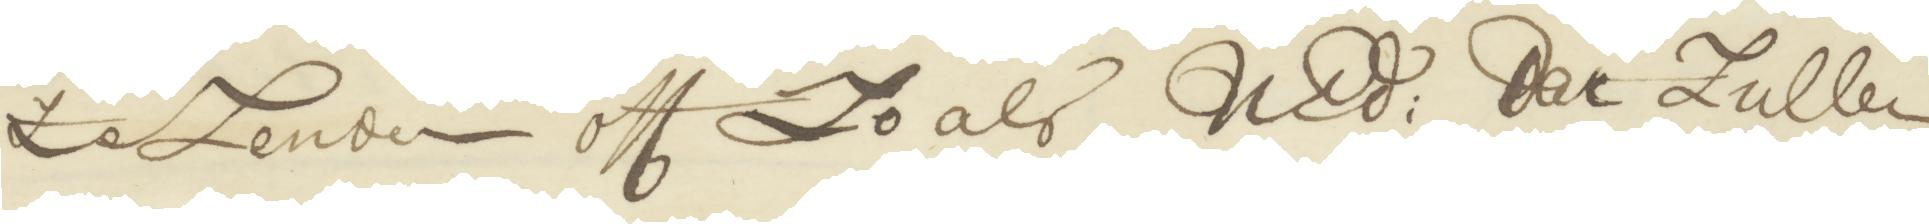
te Zenden off Zo als uEd: dat zullen
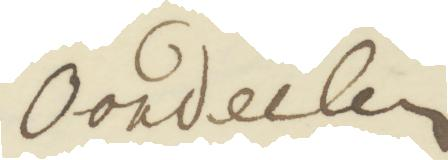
Oordeelen
